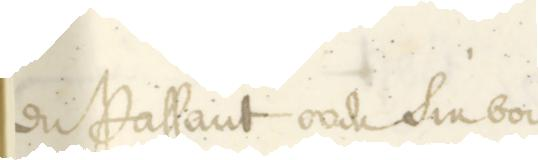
en Passant over sirbon
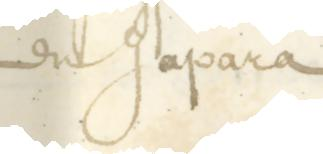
en Japara
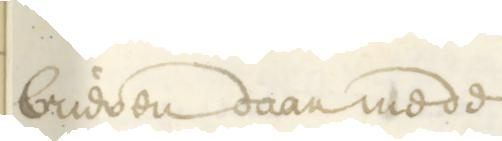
brieven daar mede
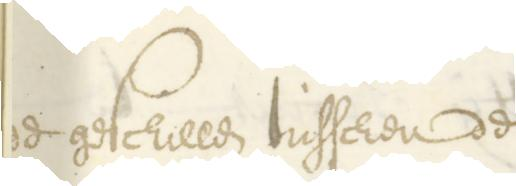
de geschillen tusschen de
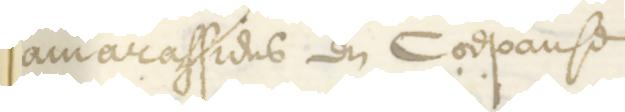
amarassiers en Coepanse
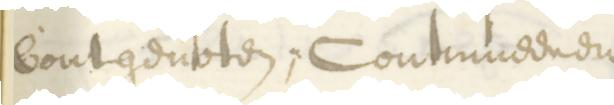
bontgenoten; Continueeren
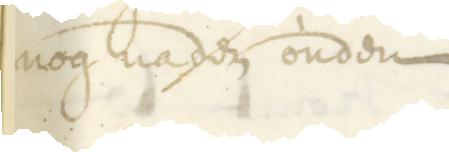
nog naden onden
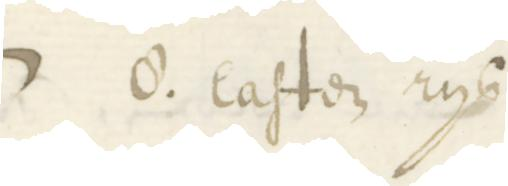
8. lasten rijs
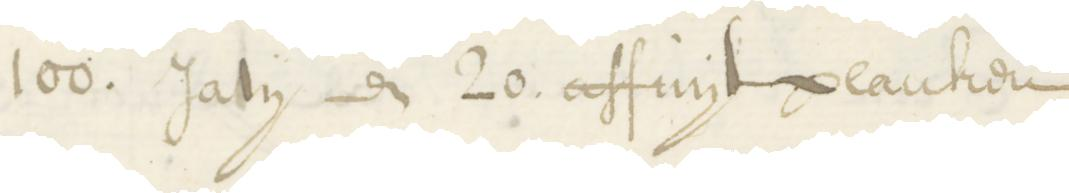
100. Jatij en 20. affuijt planken
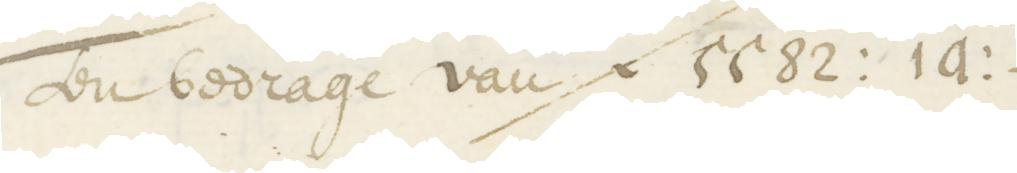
En bedrage van ƒ5532: 14:
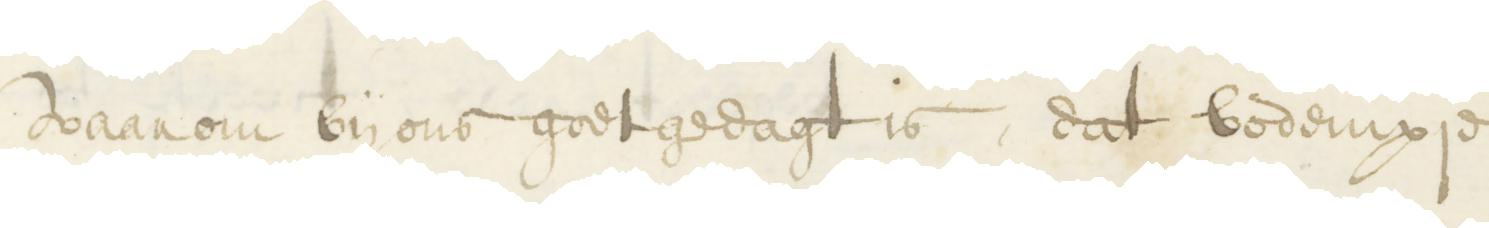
waarom bij ons goetgedagt is, dat bodempje
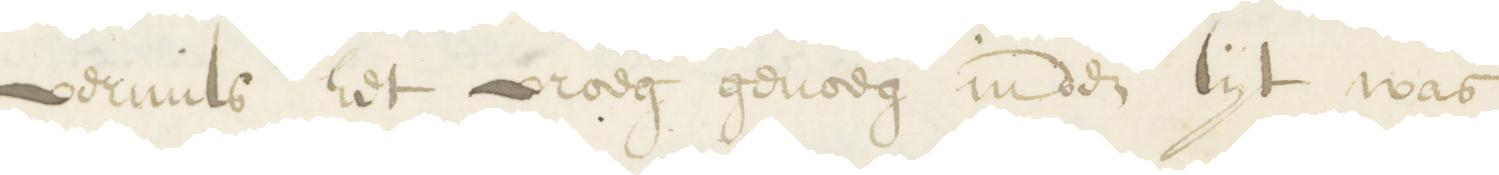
vermits het vroeg genoeg in den tijt was
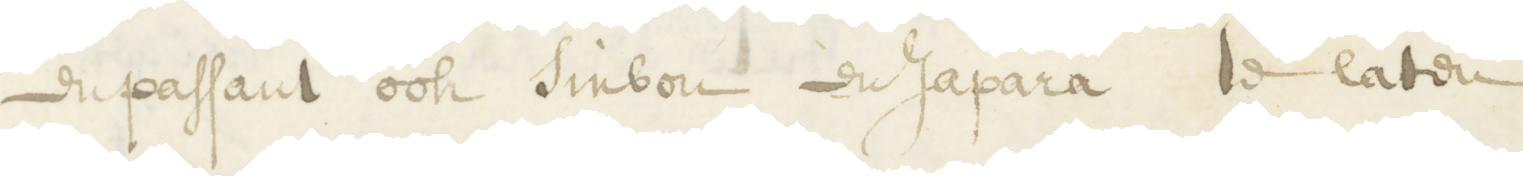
en passant ook sirbon en Japara te laten
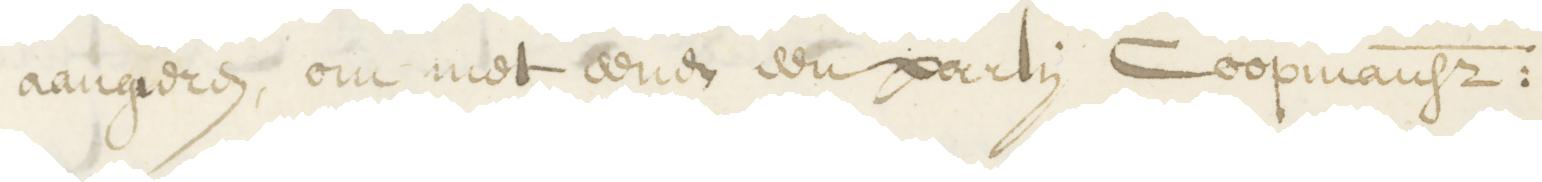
aangieren, om met eenen een partij Coopmansz:
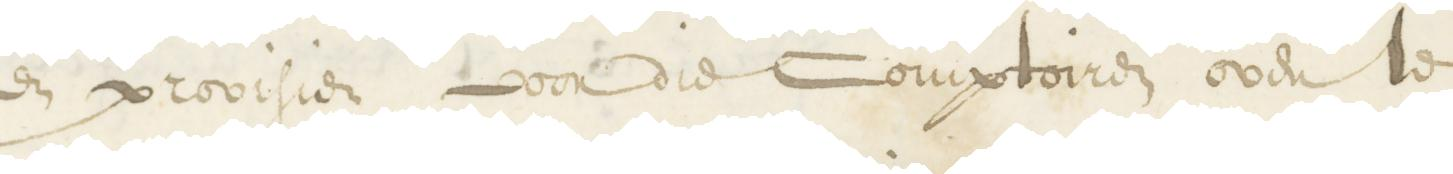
en provisien vor die comptoiren over te
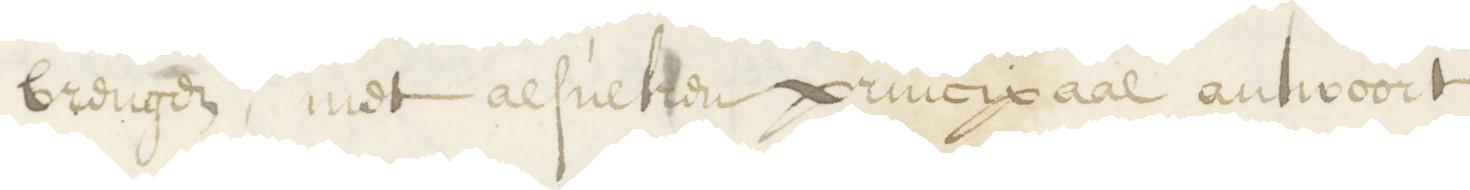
brengen, met alsulken principaal antwoort
